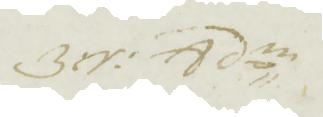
3 v: 8 d=m
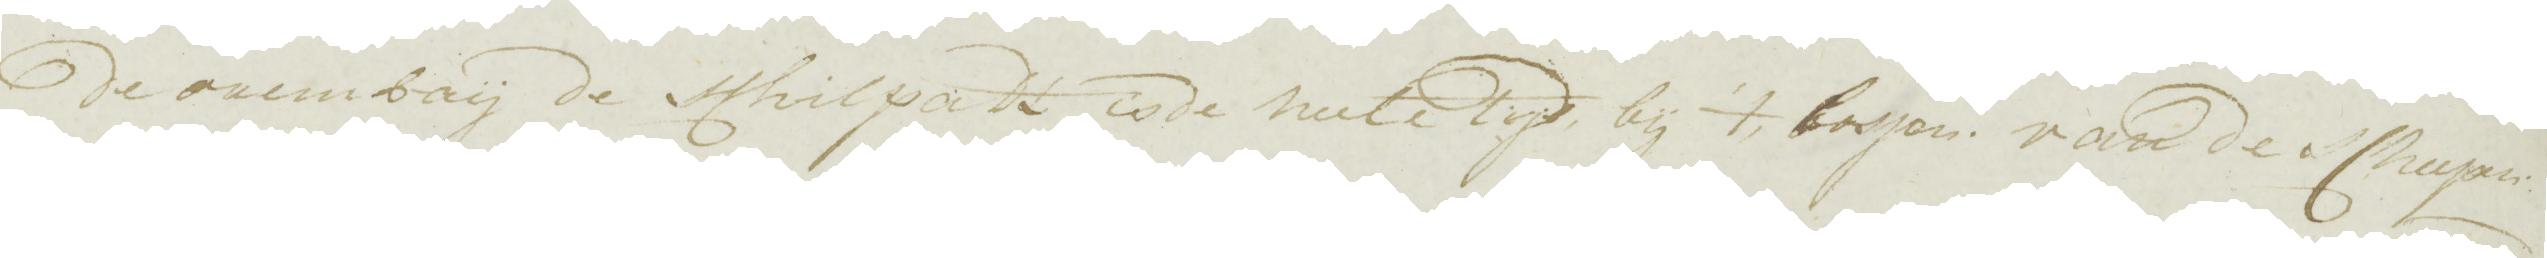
de orembaij de schilpadt is de hele tijd bij ’t lossen van de schepen
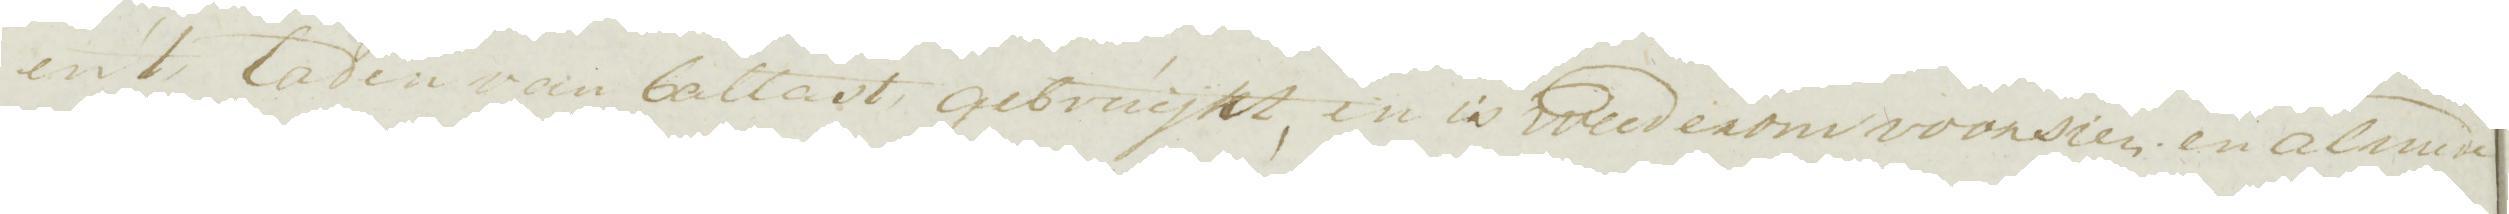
en ’t laden van ballast gebruijkt, en is weederom voorsien en almede
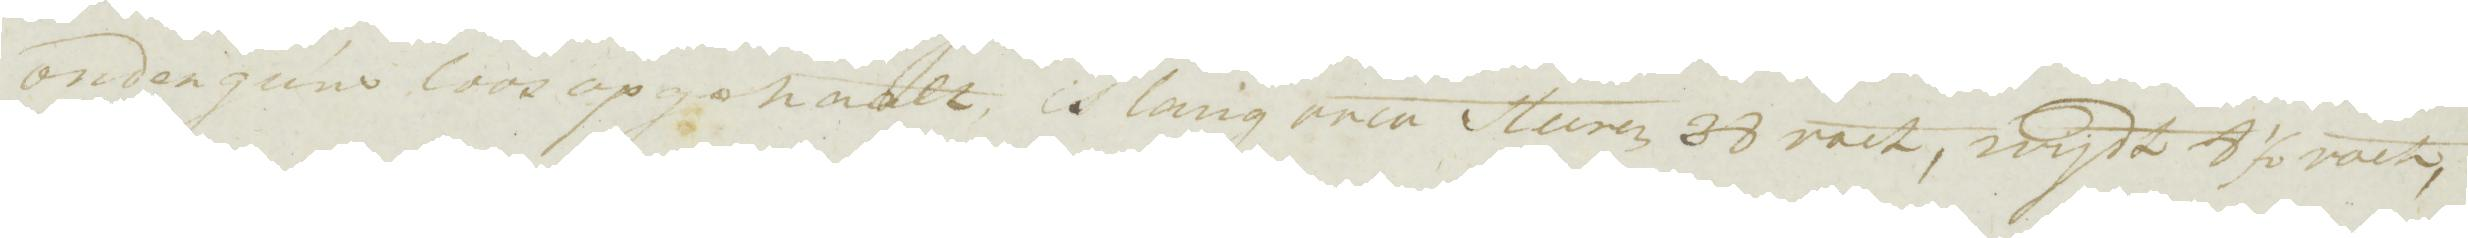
ondergun loos opgehaalt, is lang over sturen 38 voet, wijdt 8½ voet,
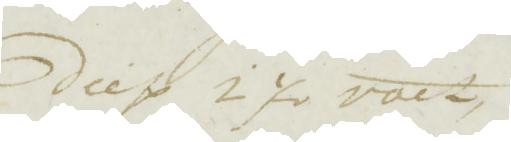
diep 2½ voet
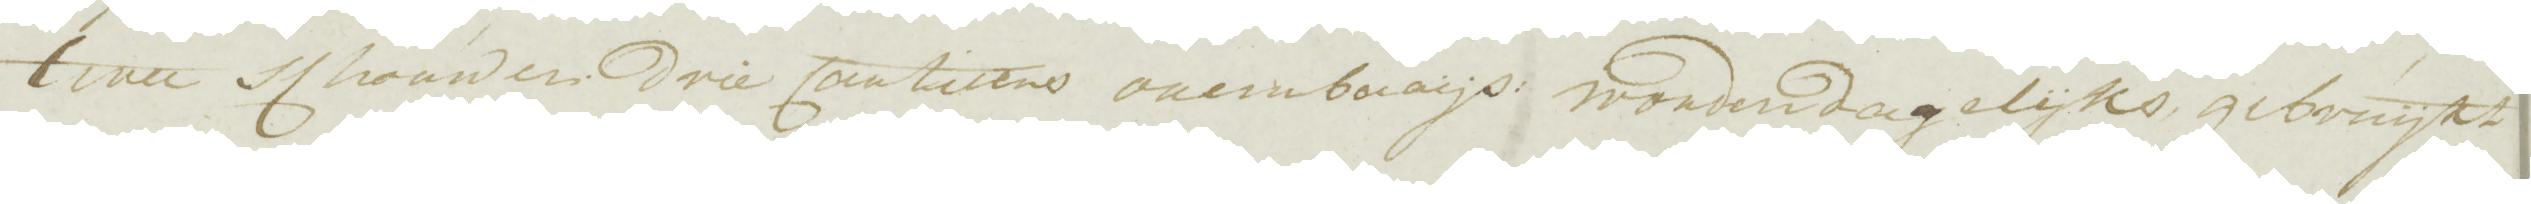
twee schouwen drie cartilens orembaaijs worden dagelijks gebruijkt
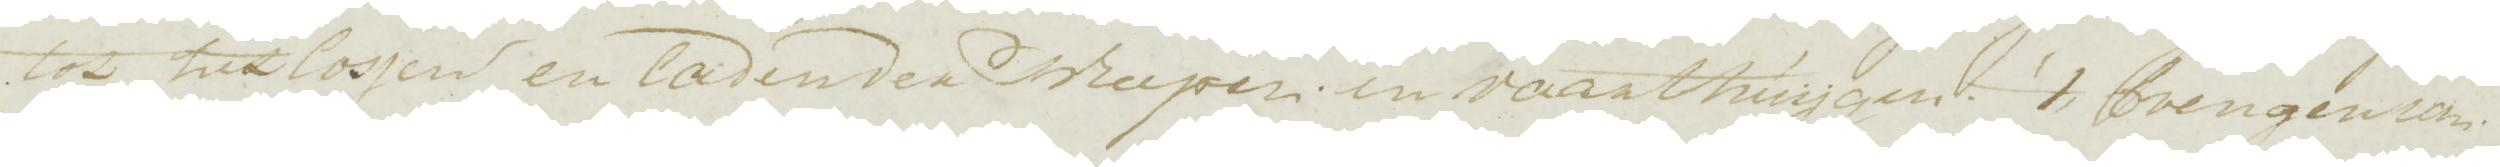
tot het lossen en laden der scheepen en vaarthuijgen 't brengen van
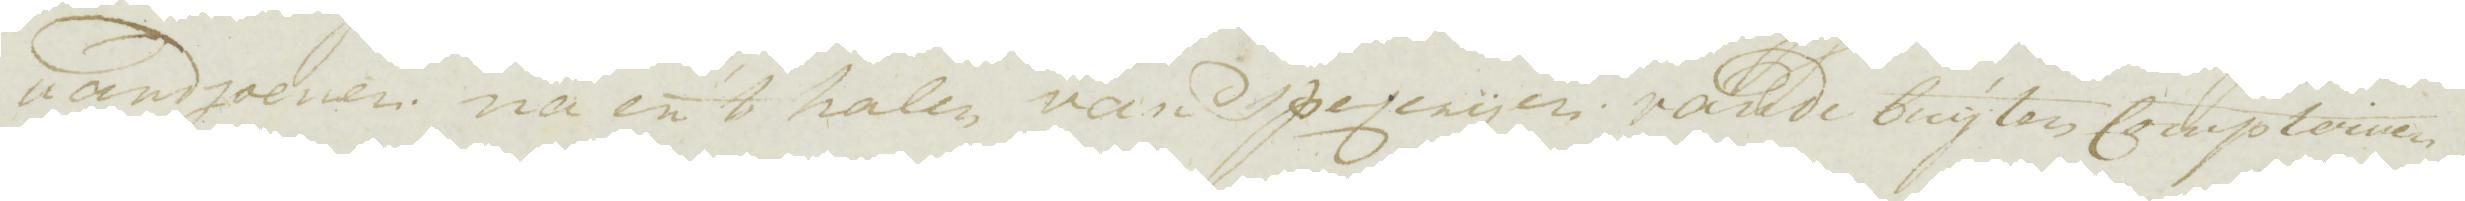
randsoenen na en ’t halen van specerijen vande buijten Comptoiren
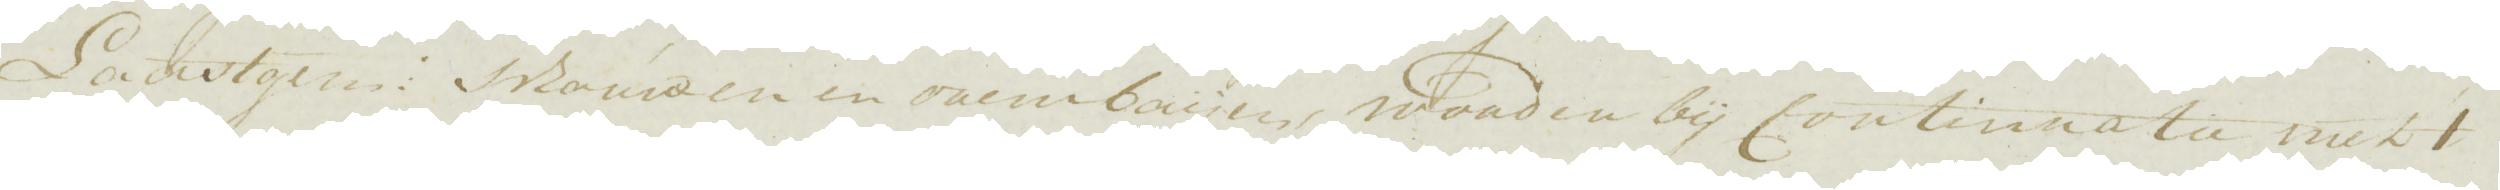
Laastgem: schouwen en orembaijen, worden bij continuatie met ’t
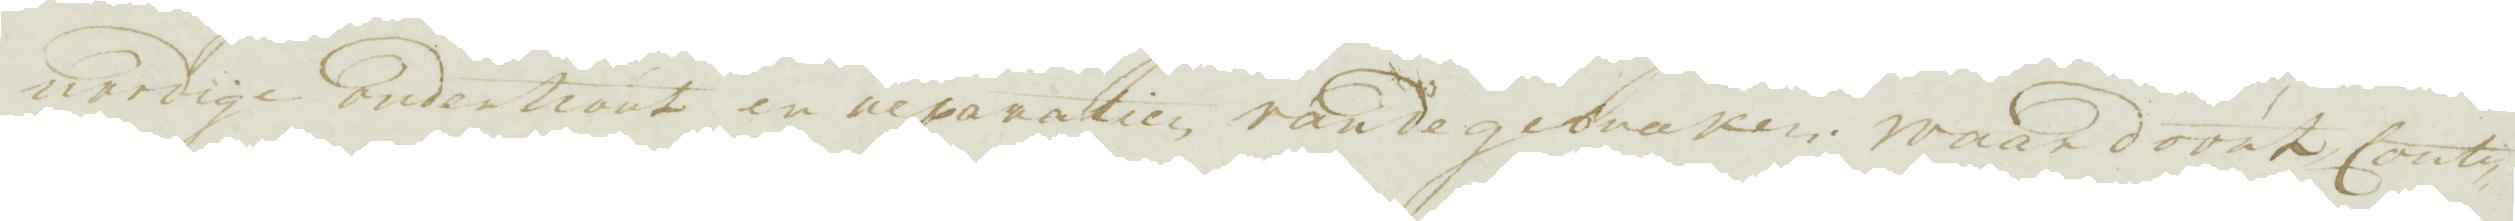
noodige onderhout en reparatien van de gebreeken waar door 't conti„
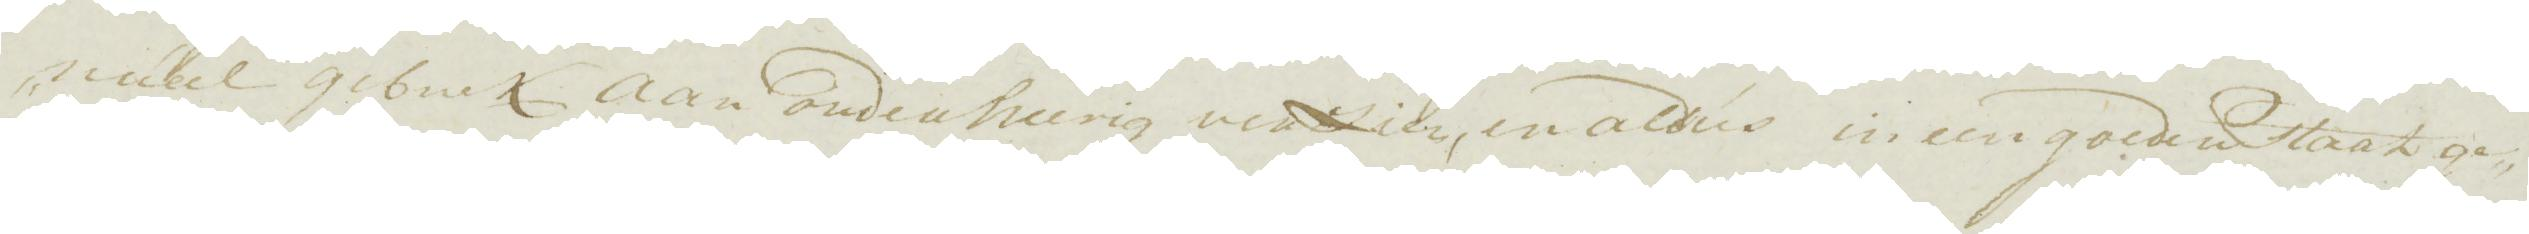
„nueel gebrek aan onderheevig verzien, en aldus in een goeden staat ge„
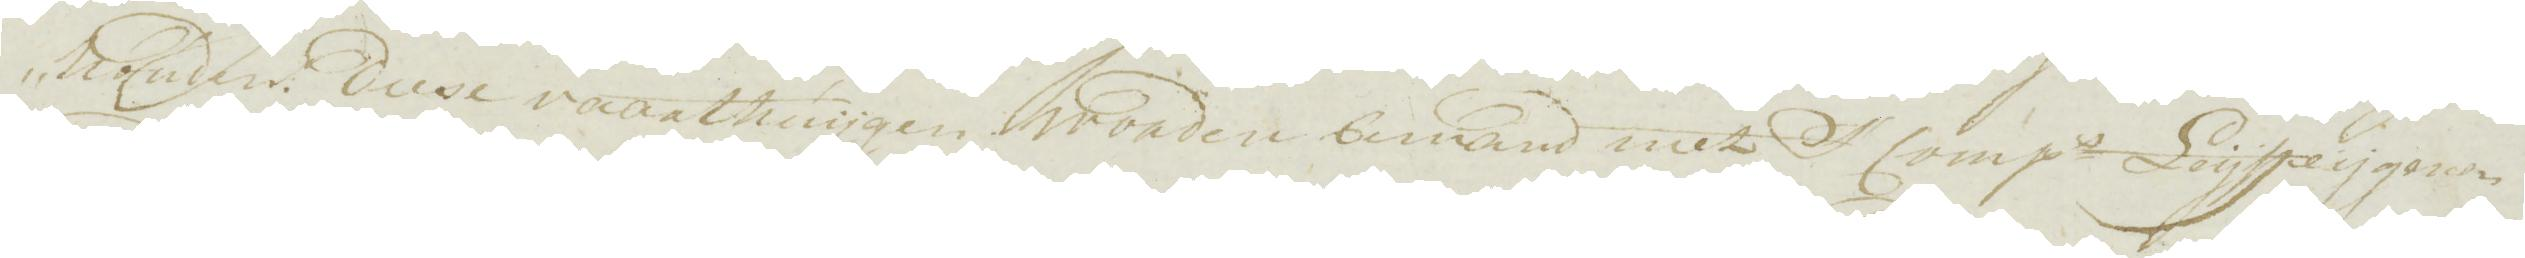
„houden deese vaarthuijgen worden bemand met S Comp=s Leijffeijgenen
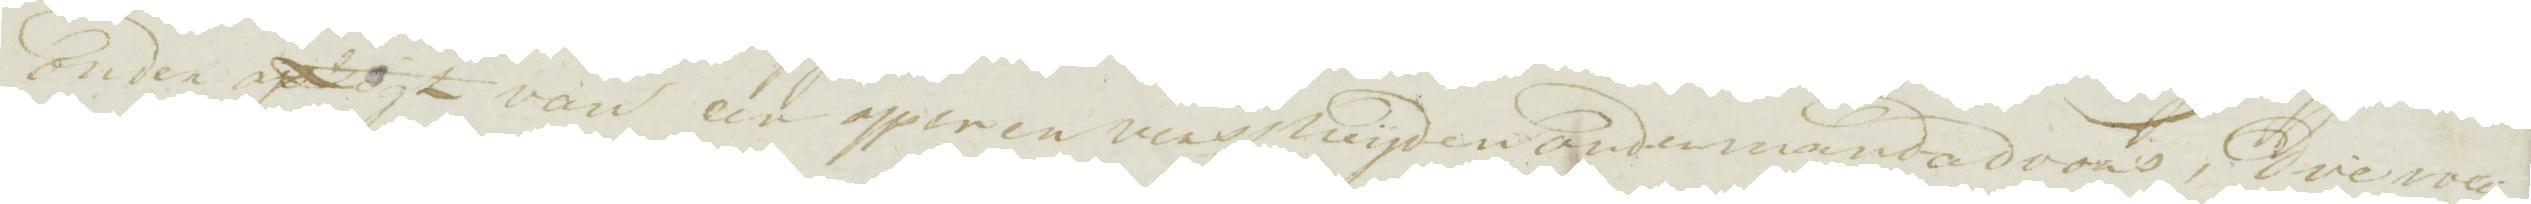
onder opzigt van een opper en verschuijden ondermandadoors, drie roeij
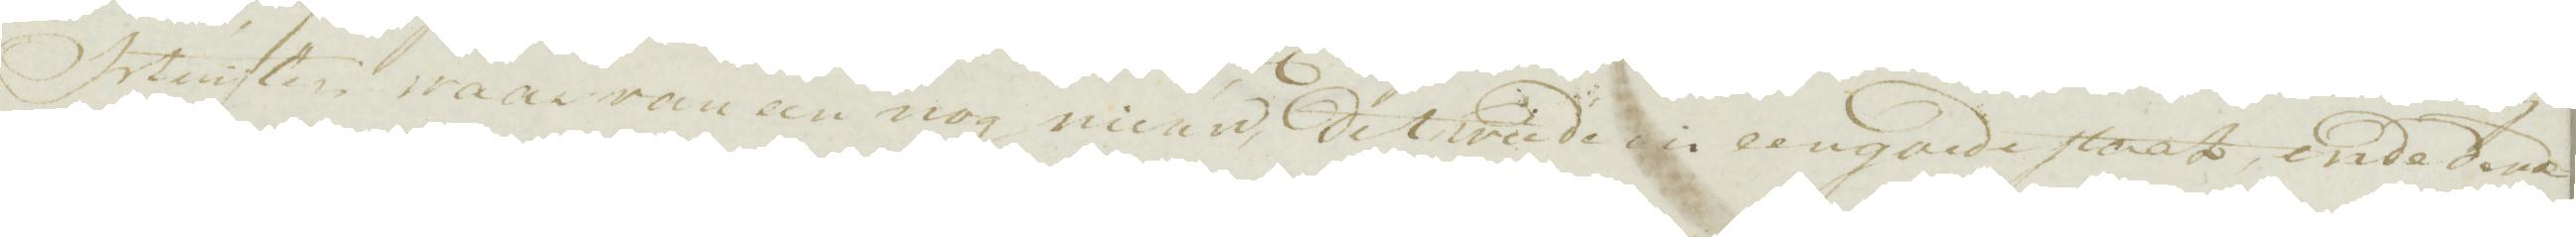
Schuijten waar van een nog nieuw de tweede in een goede staat, ende derde
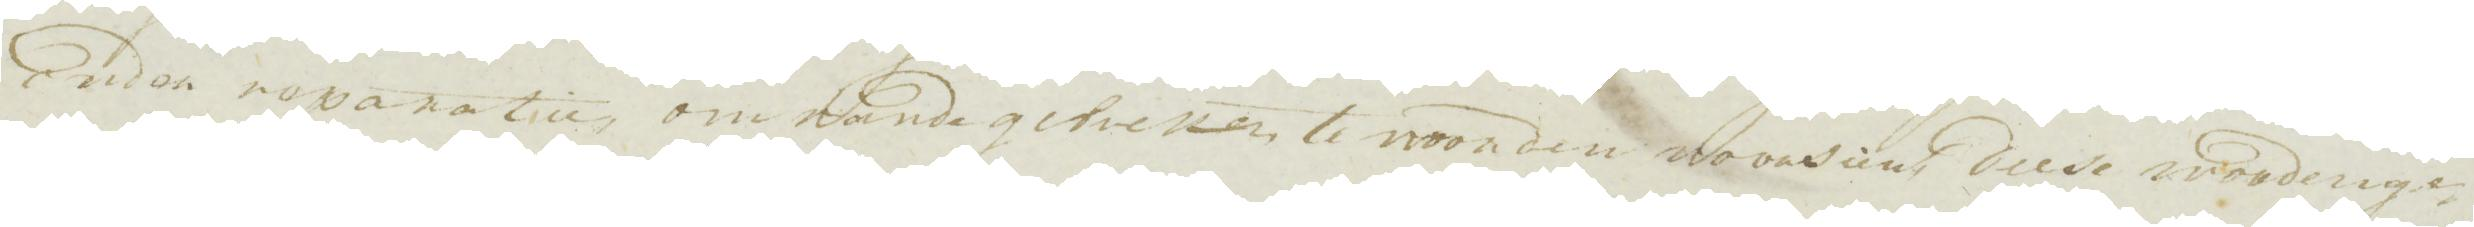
onder reparatien om vande gebreken te woorden voorsien, deese wordenge„
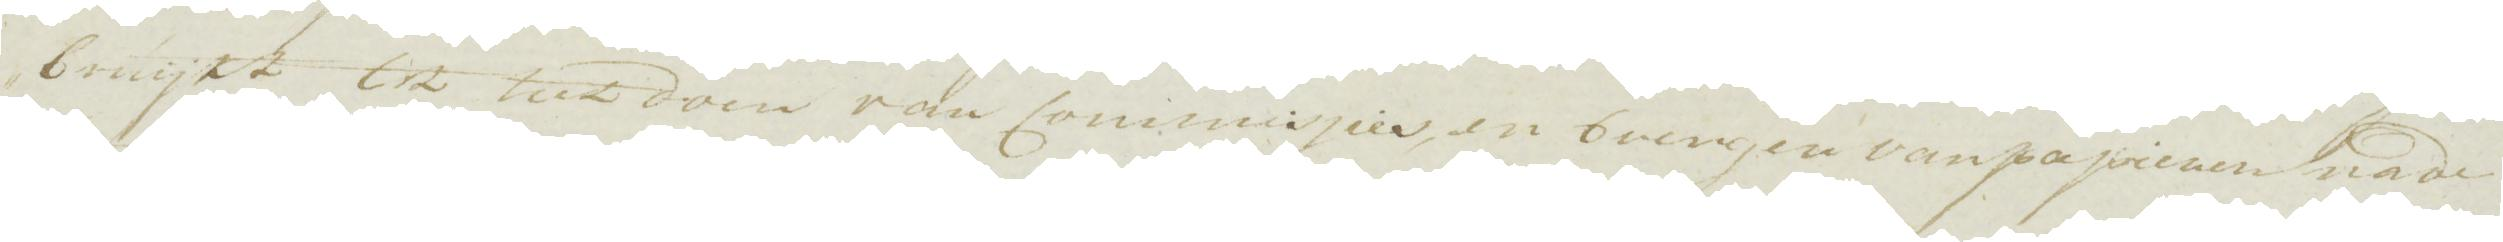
„bruijkt tot het doen van commissies, en brengen van papieren na de
